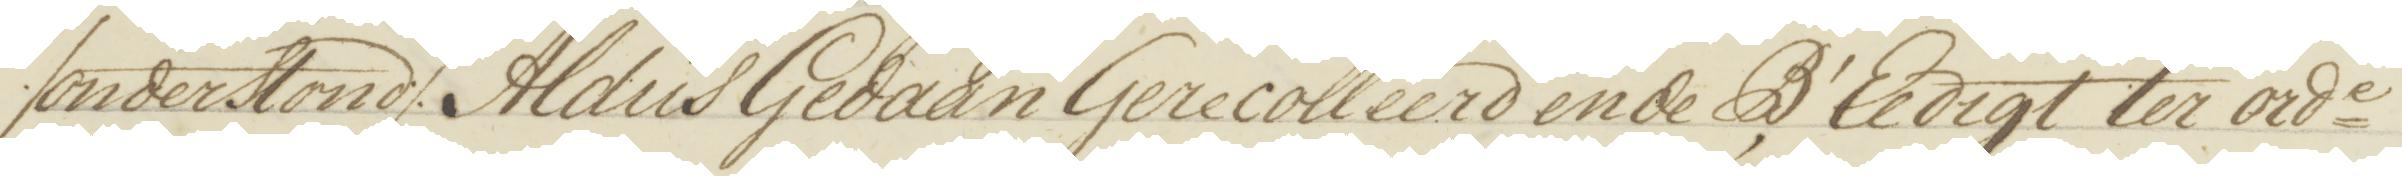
/onderstond/ Aldus Gedaan Gerecolleerd ende B' Eedigt ter ord=e
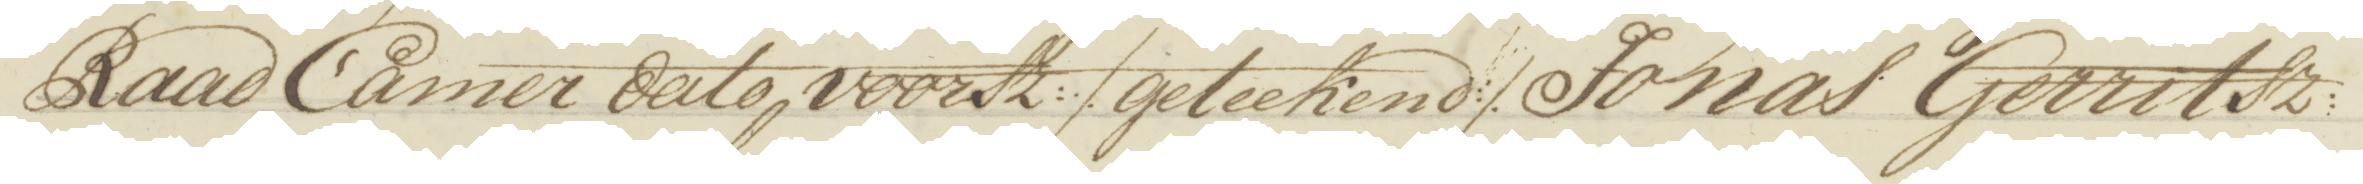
Raad Camer dato voorsz: ./.geteekend:/ Jonas Gerritsz:
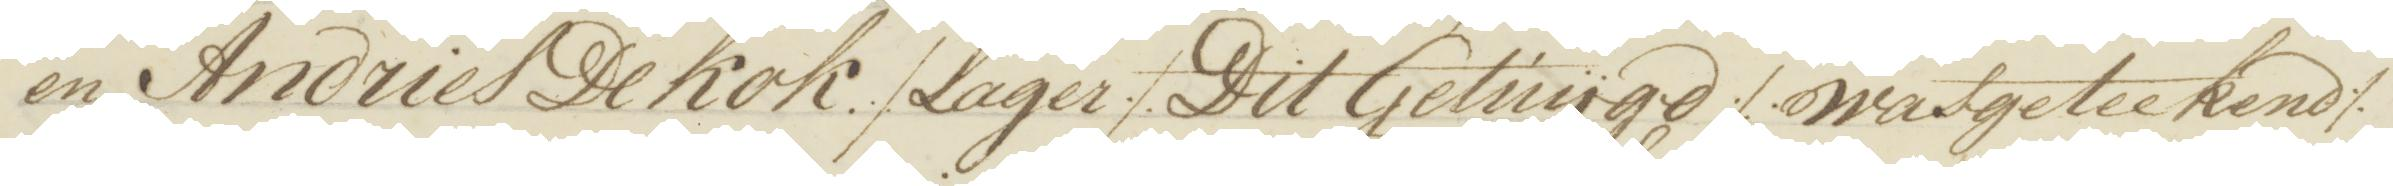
en Andries De kok . ./. Lager ./. Dit Getuijgd ./. was geteekend./.
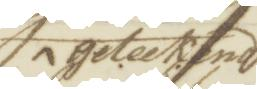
^geteekend
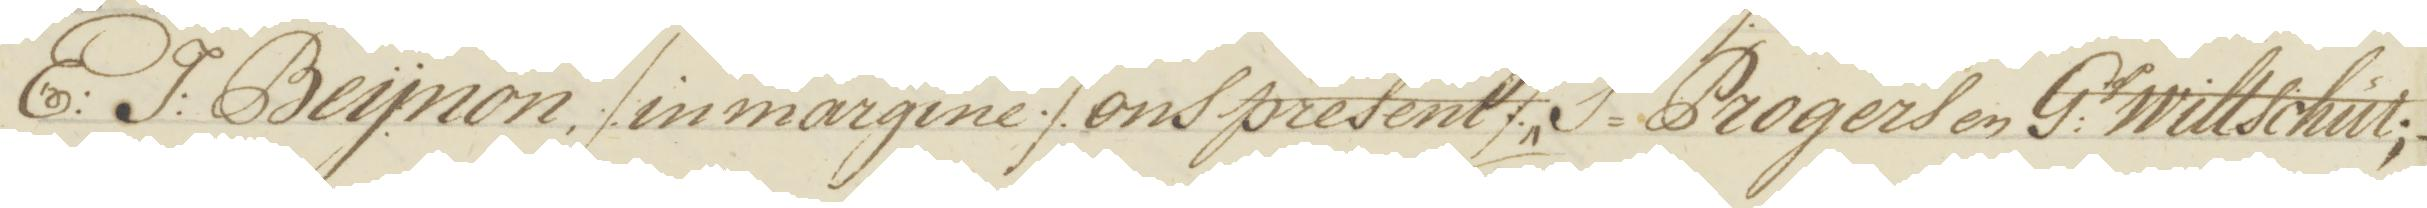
E: J: Beijnon ./. in margine ./. ons present / ^ S=n Progers en G:f Wiltschut;
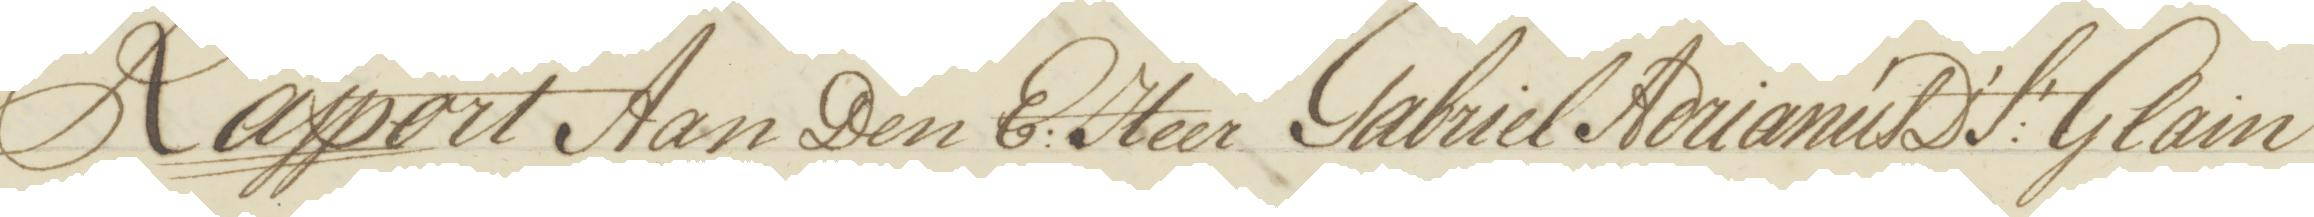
Rapport Aan Den E: Heer Gabriel Adrianus d'S:t Glain
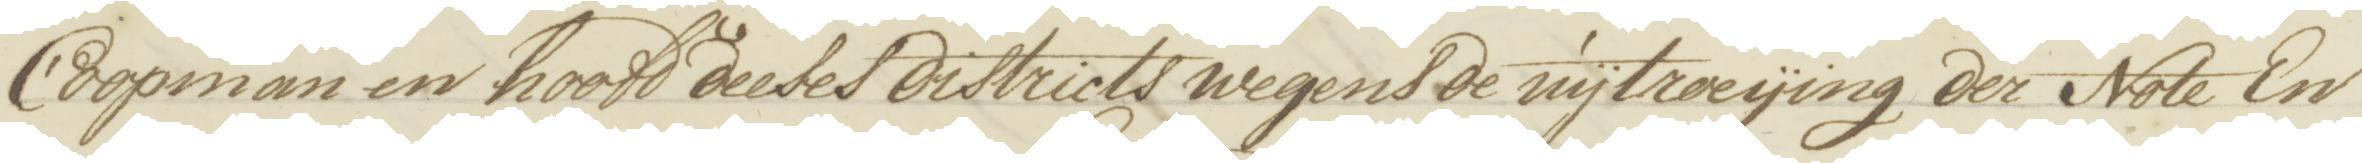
Coopman en hoofd deeses districts wegens de uijtroeijing der Note En
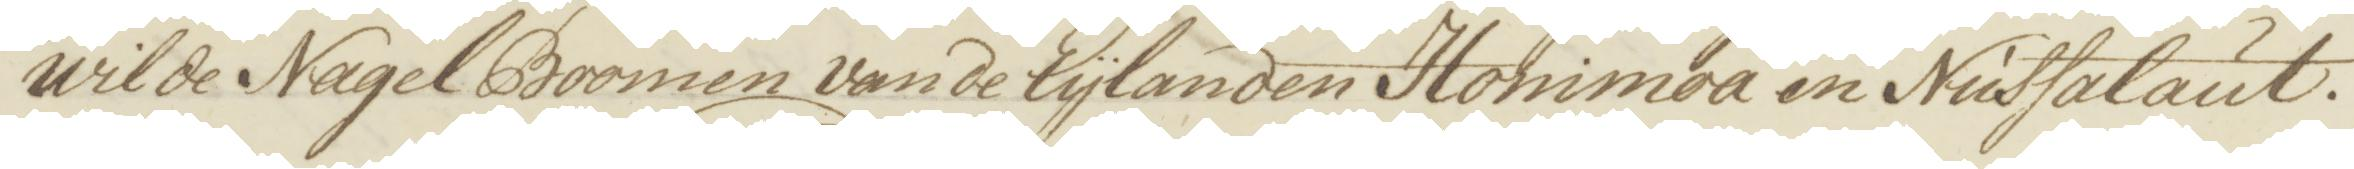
wilde Nagel Boomen van de Eijlanden Honimoa en Nussalaut.
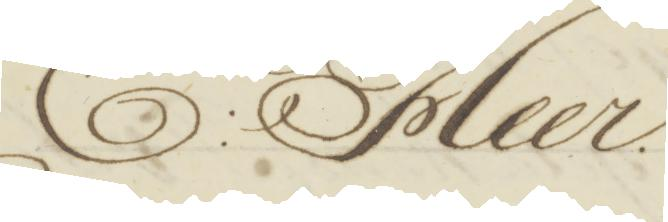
E: Heer.
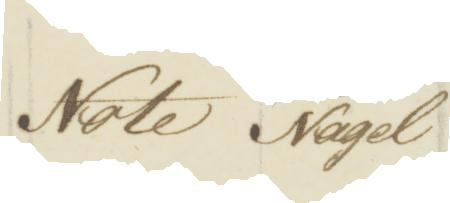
Note Nagel
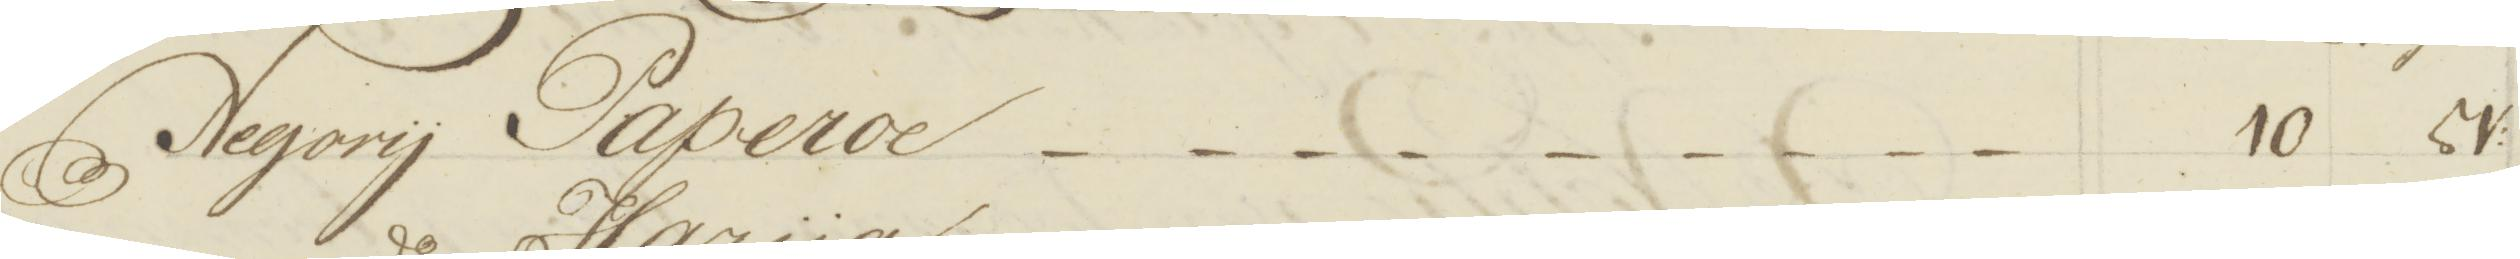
Negorij Paperoe 10 51:
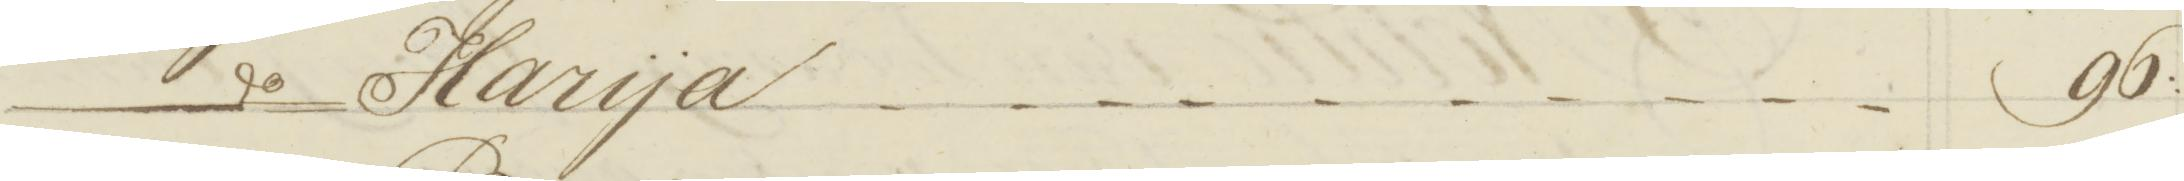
—:o Harija 96: —
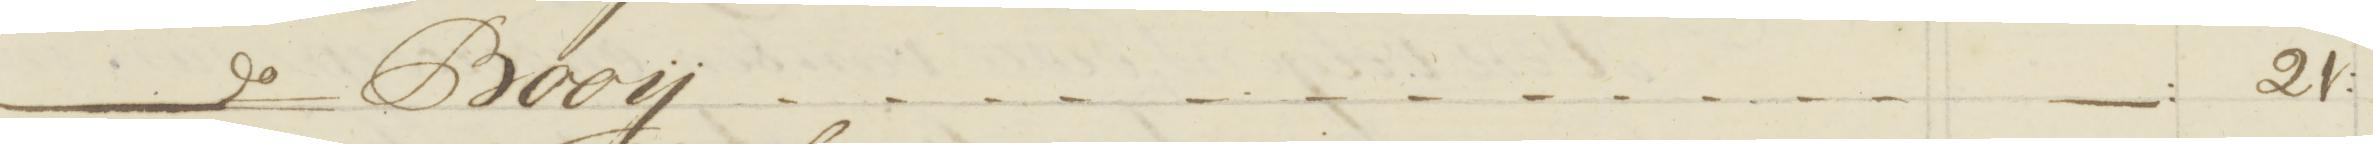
—:o Booij —: 21:
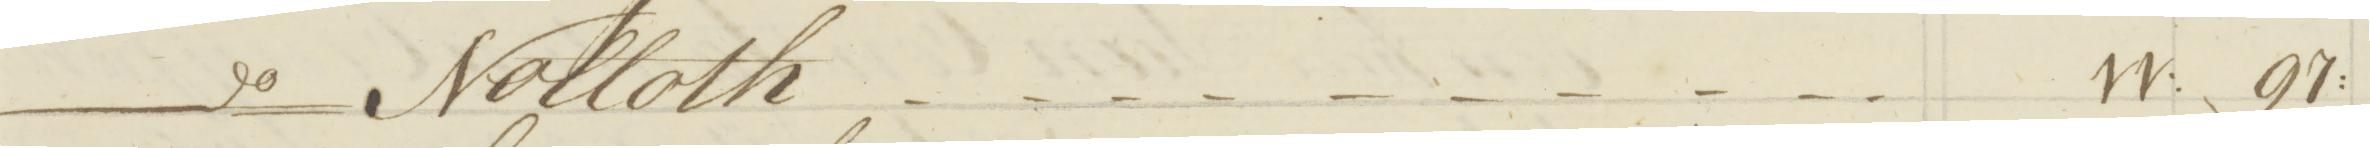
—:o Nolloth 11: 97:
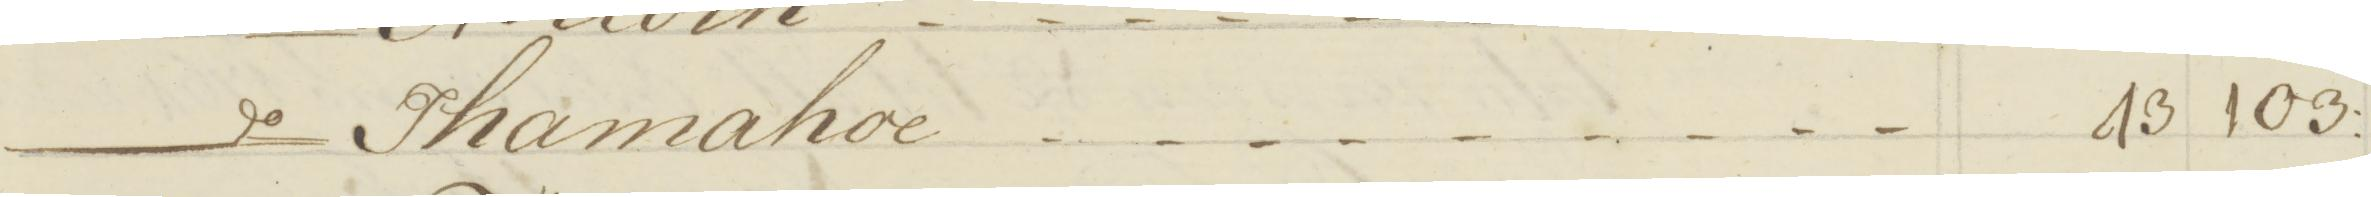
—:o Ihamahoe 43 103:
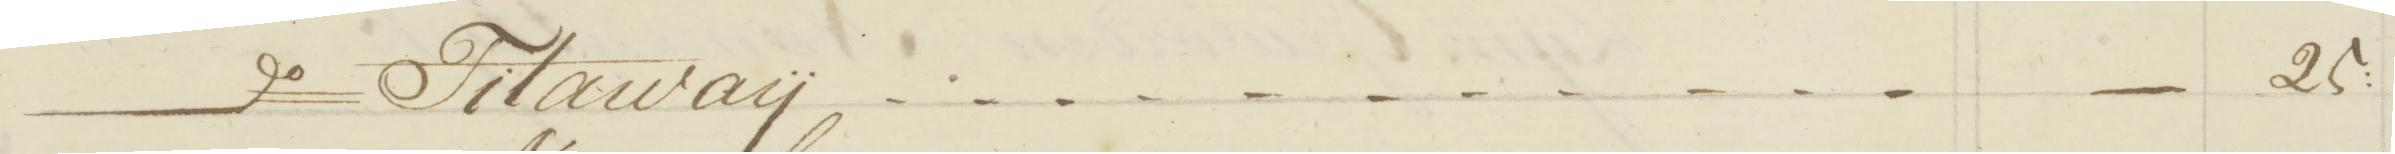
—:o Titawaij — 25:
